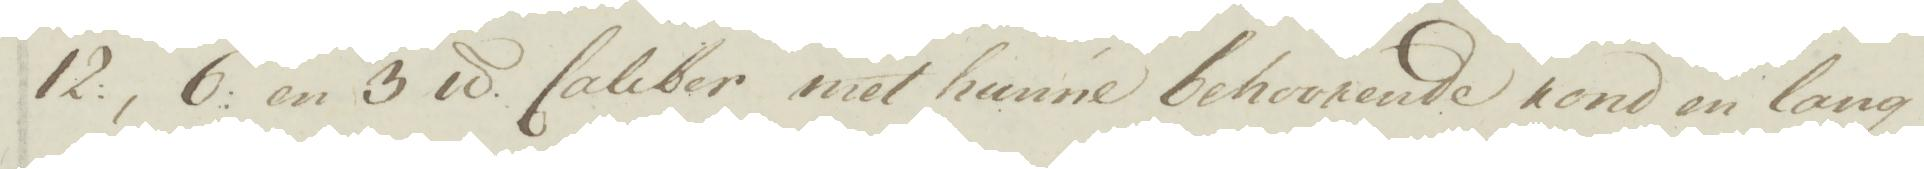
12:, 6: en 3 lb. Coliber met hunne behoorende rond en lang
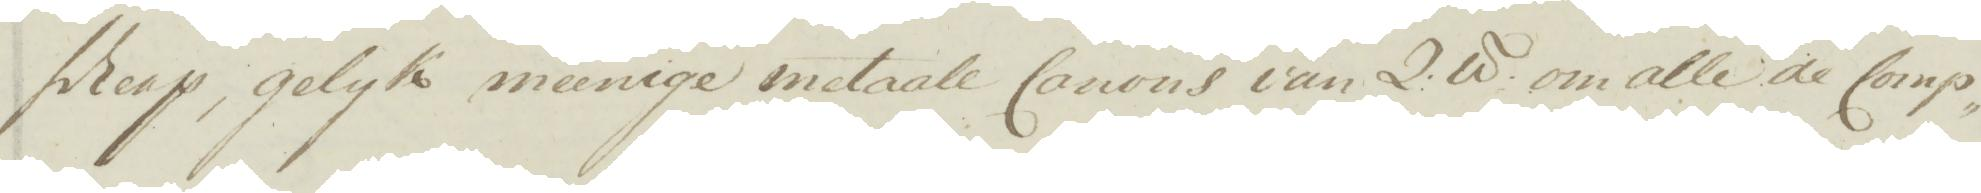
scherp, gelyk meenige metaale Canons van 2: lb: om alle de Comp„
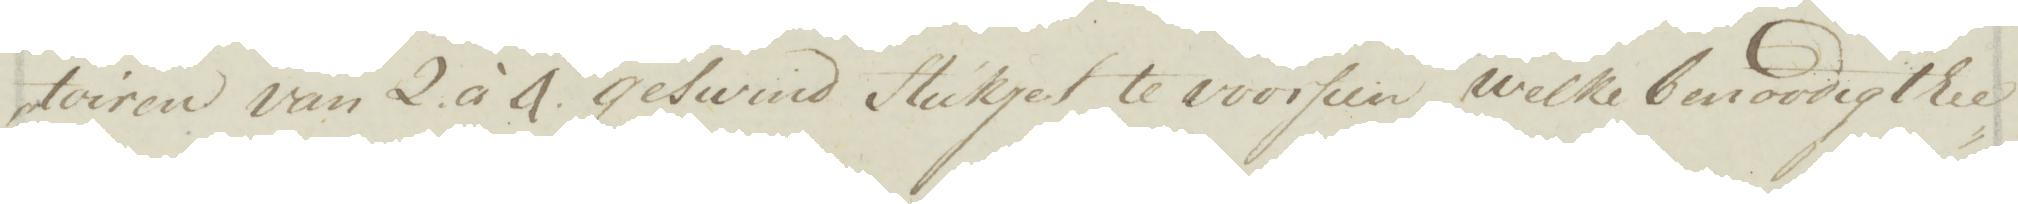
toiren van 2. à 4. geswind stukjes te voorsien, welke benoodigthee„
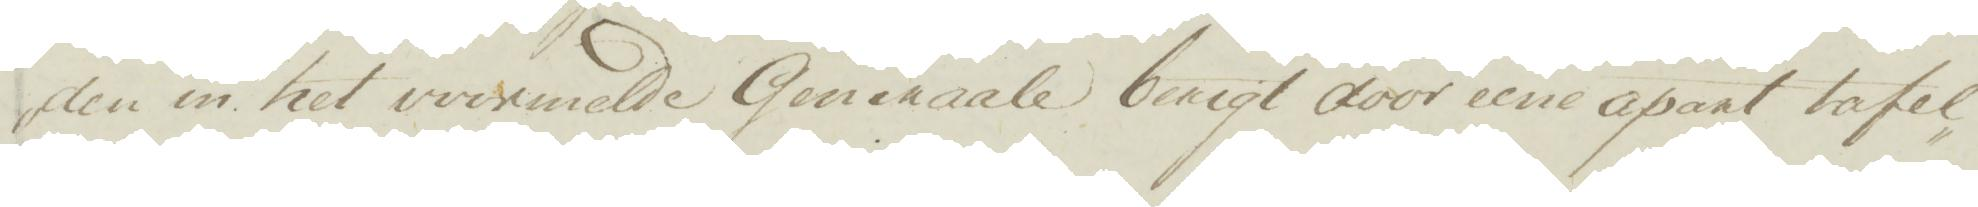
„den in het voormelde Generaale berigt door eene apart tafel„
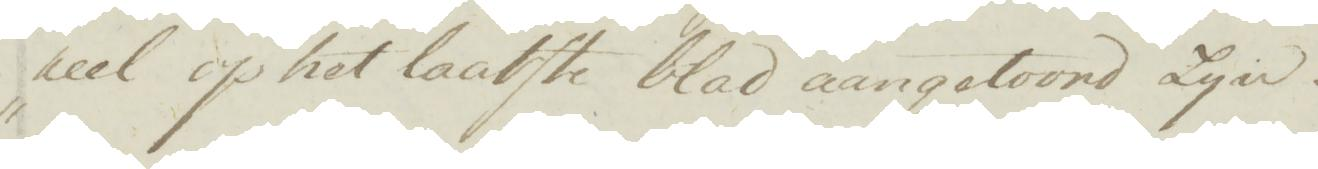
„reel op het laatste blad aangetoond zyn. —
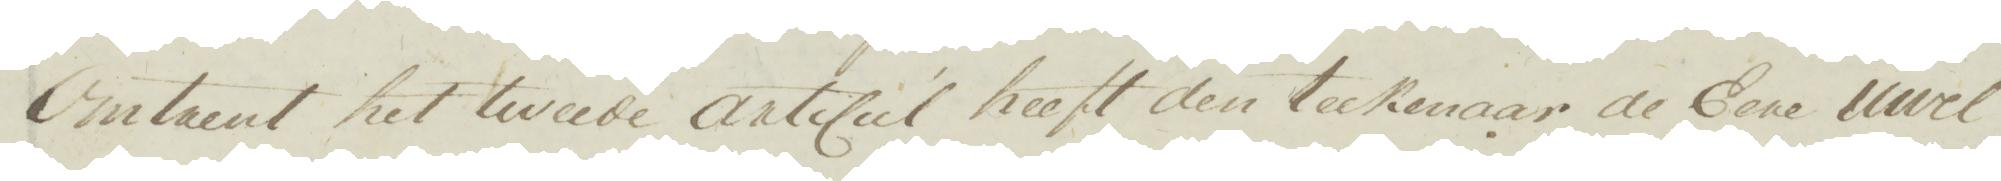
Omtrent het tweede articul heeft den teekenaar de Eere uwel
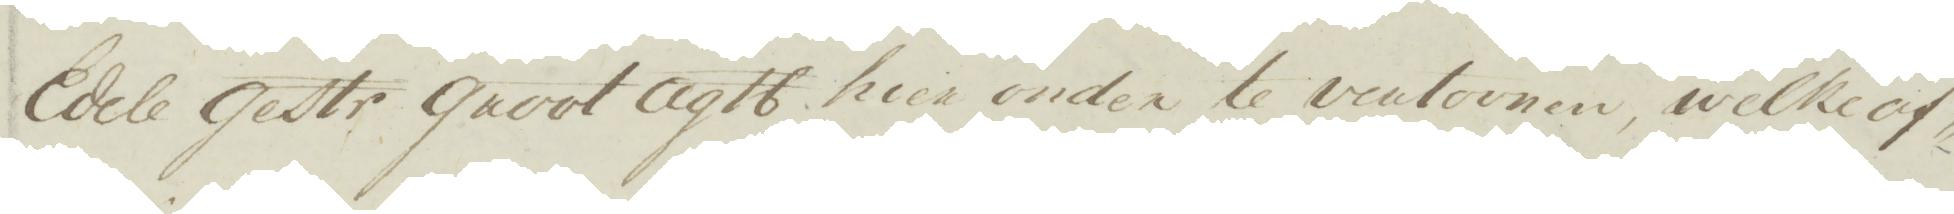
Edele Gestr Groot agtb. hier onder te vertoonen, welke af
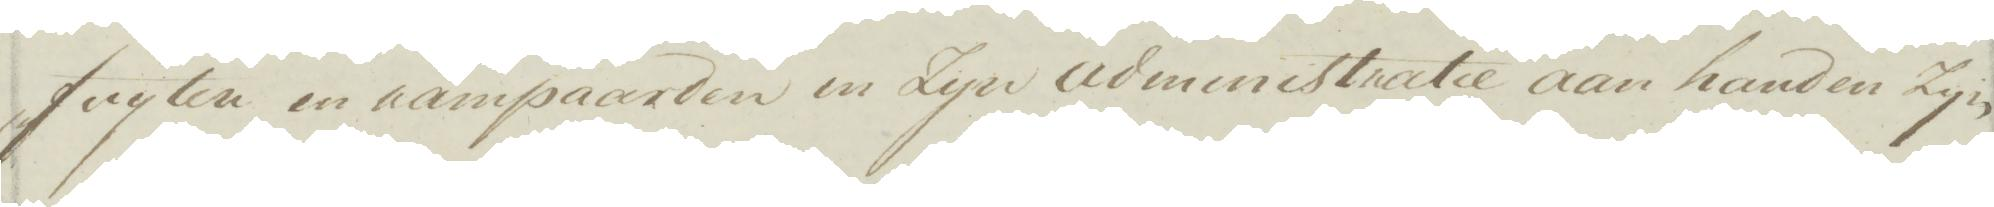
„fuijten en rampaarden in zyn administratie aan handen zijn,
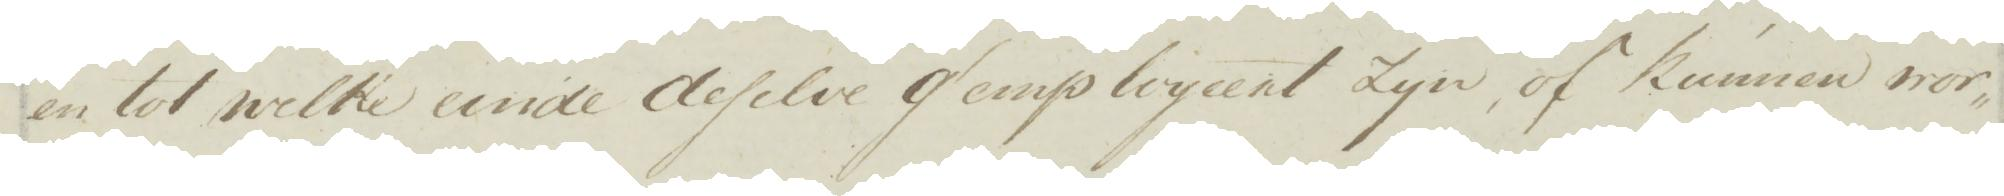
en tot welke einde deselve g’emploijeert zyn, of kunnen wor„
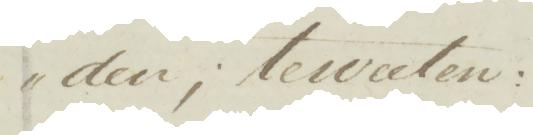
„den; teweeten:
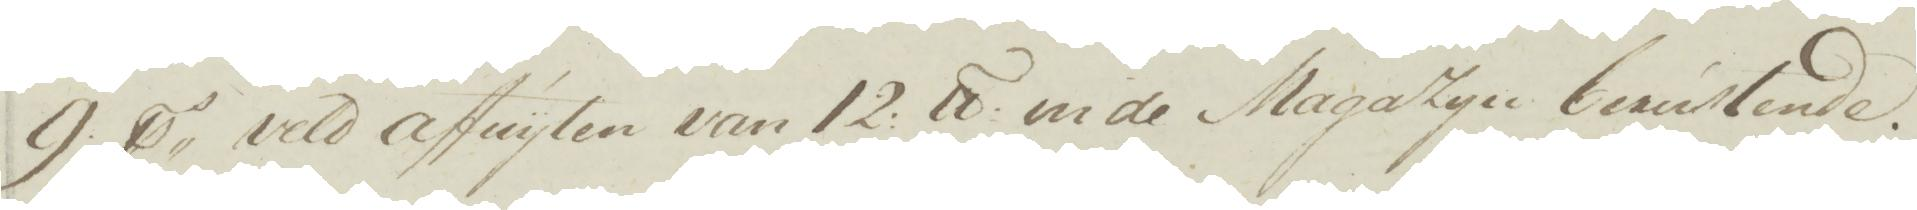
9: p„s veld affuijten van 12: lb: in de Magazyn berustende.
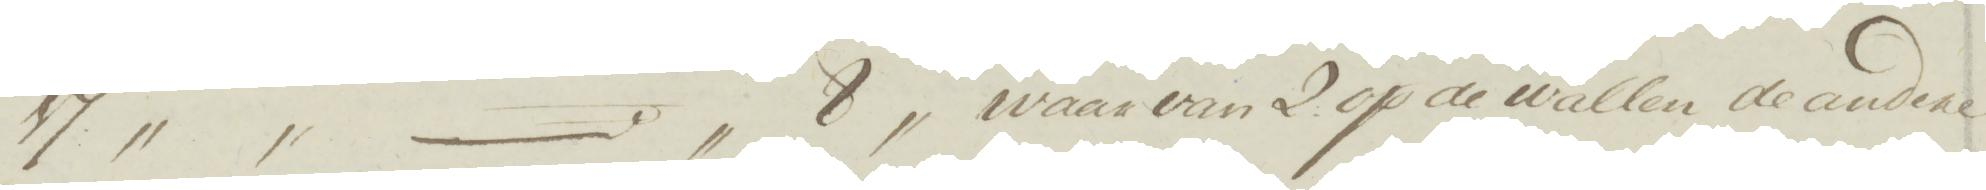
17 „ „ _o „ 8 „ waar van 2 op de wallen de andere
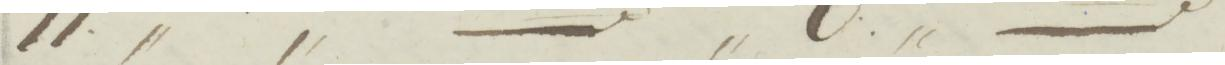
11 „ „ _o „ 6: „ _o
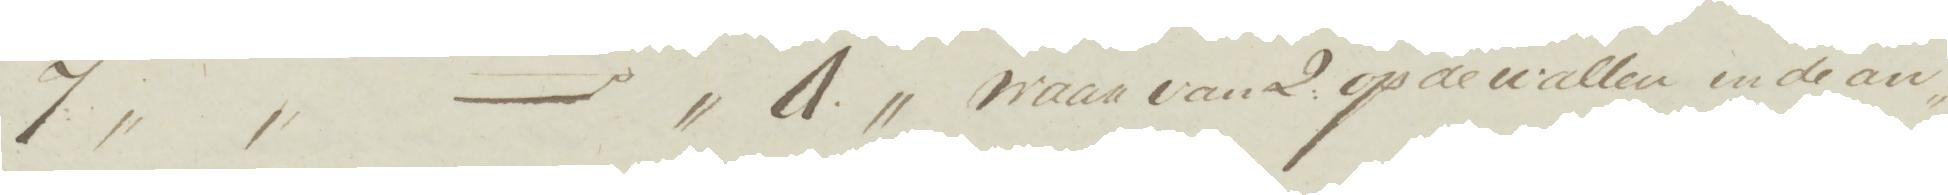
7 „ „ _o „ 4. „ waar van 2: op de wallen in de an
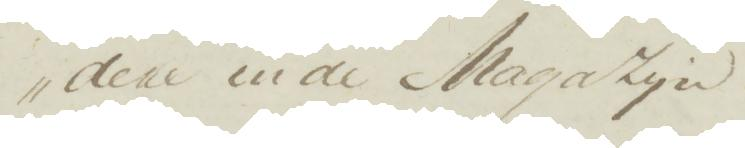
„dere in de Magazijn.
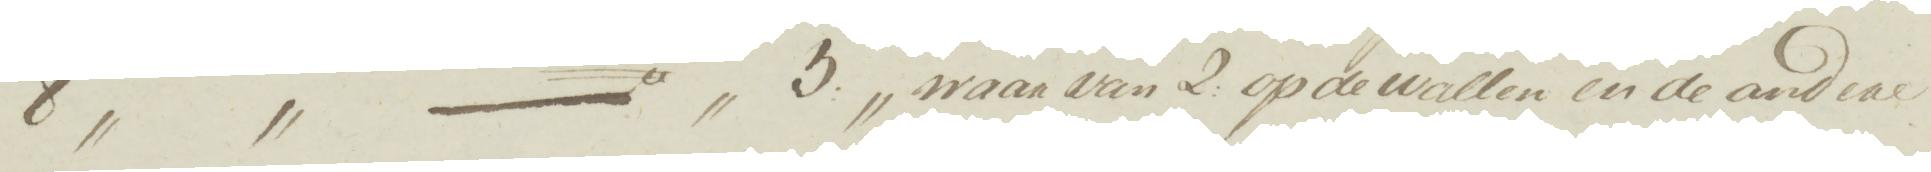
8 „ „ _o „ 3: „ waar van 2: op de wallen en de andere
